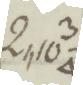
2„10¾
